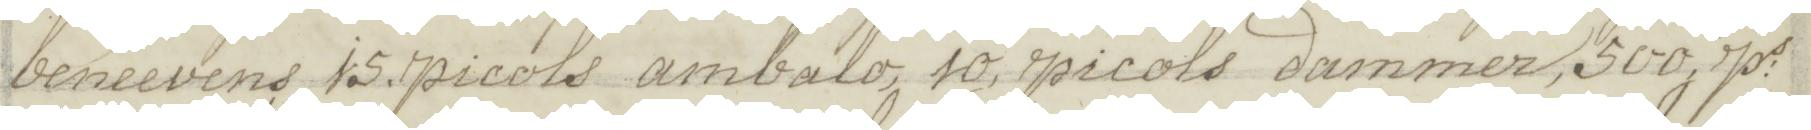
beneevens 15. picols ambalo, 10. picols dammer, 500, p:s
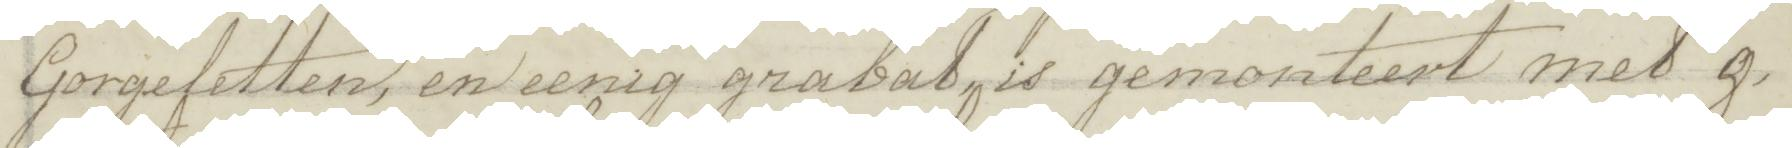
Gorgeletten, en eenig grabat, is gemonteert met 9.
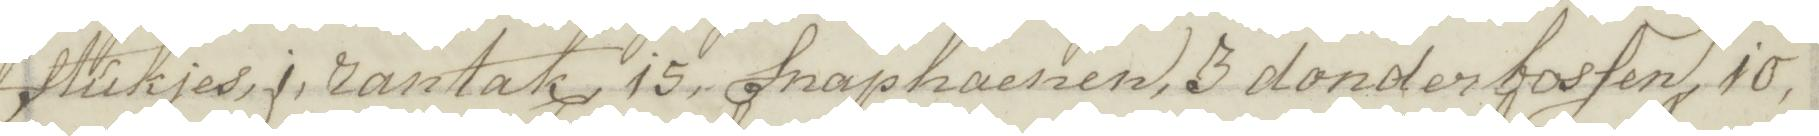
stukjes, 1, rantak 15. Snaphaenen, 3 donderbossen, 10,
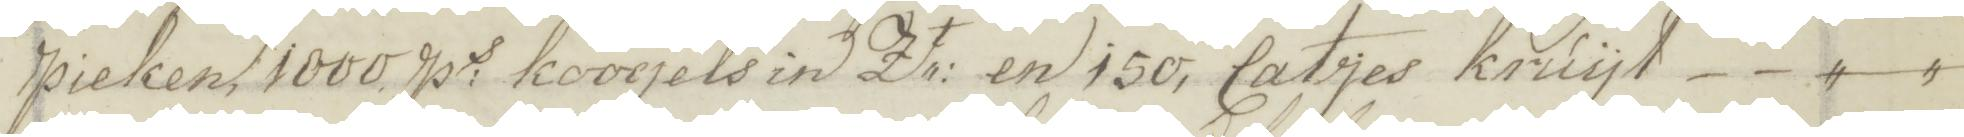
pieken, 1000. p:s koogels in Z„:t en 150, Catjes kruijt - - „ „
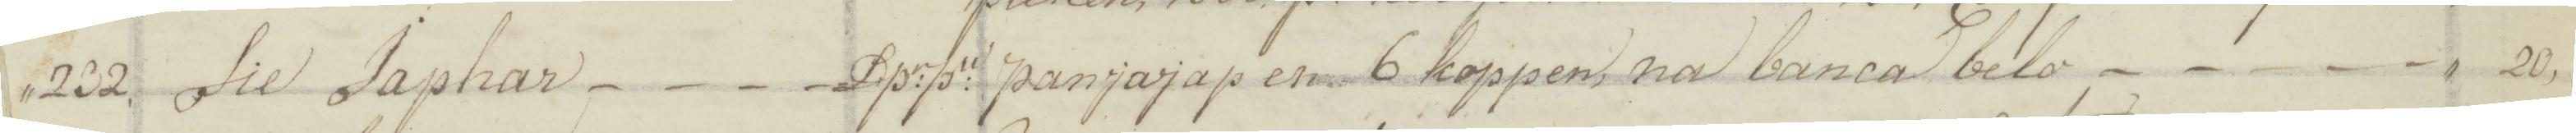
„ 232, sie Japhar - - - - Dp:r p:w panjajap en 6 koppen na banca belo - - - - - „ 20,
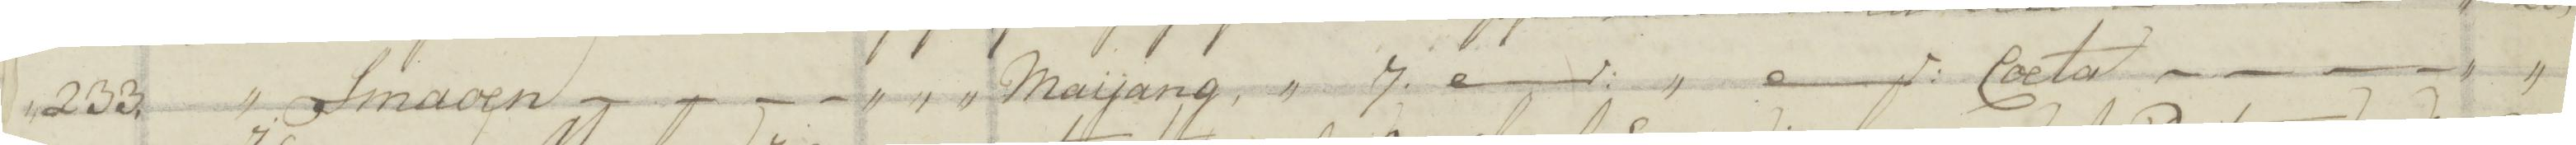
„ 233 „ Smaoen - - - - „ „ „ Maijang, „ 7 _:o „ _:o Coeta - - - - „ „
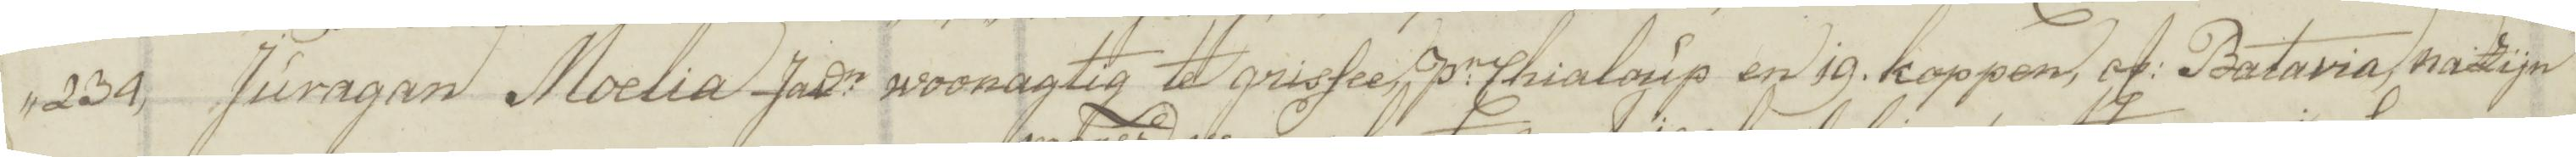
„ 234 „ Juragan Moelia Jav:n woonagtig te grissee, p:r Chialoup en 19. koppen, over Batavia, na zijn
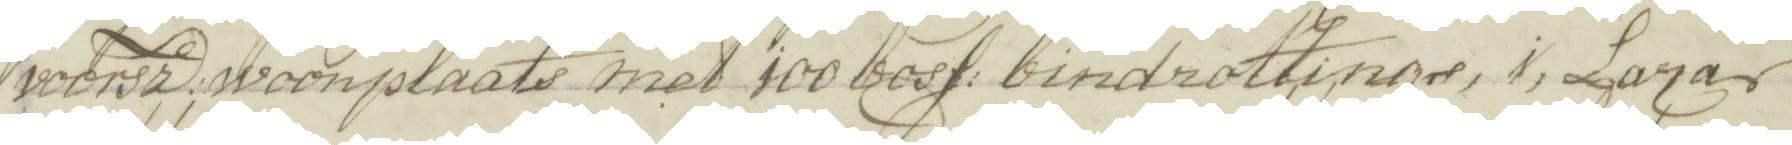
voorsz: woonplaats met 100 boss: bindrottings, 1: Laxar
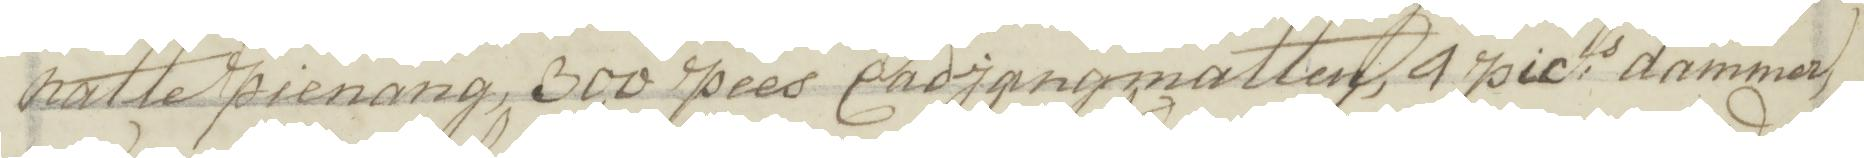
natte pienang, 300 pees Cadjangmatten, 4 pic:s dammer,
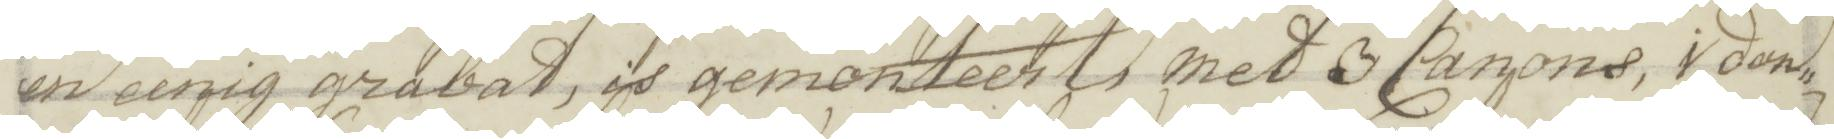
en eenig grabat, is gemonteert met 3 Canons, 1 don„
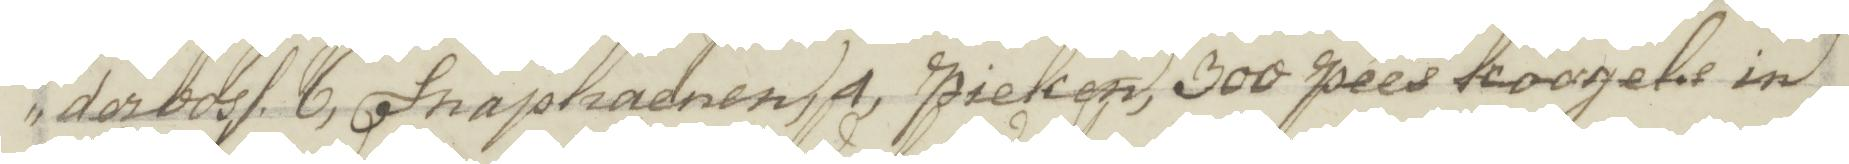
„derboss. 6, Snaphaenen, 4, Pieken, 300 pees koogels in
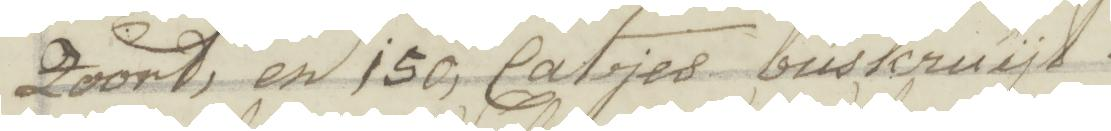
zoord, en 150, Catjes buskruijt
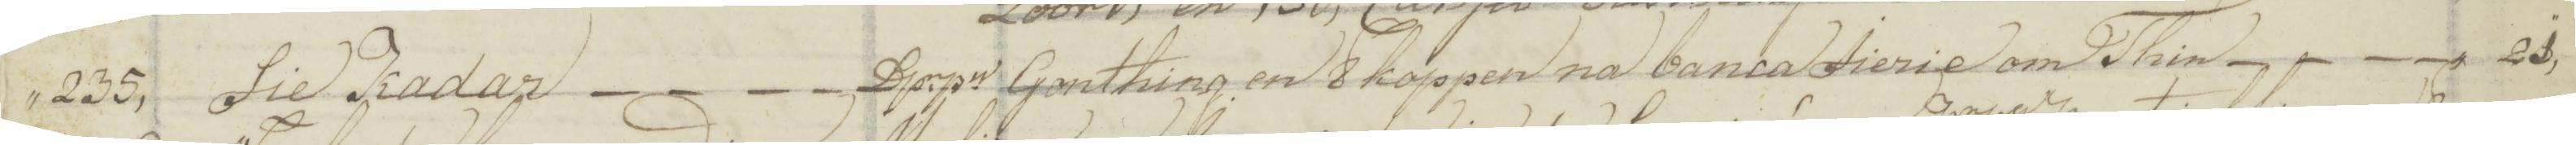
„ 235, Sie Kadan - - - - Dp:r p:w Gonthing en 8 koppen na banca Iierie om Thin - - - -„ 21,
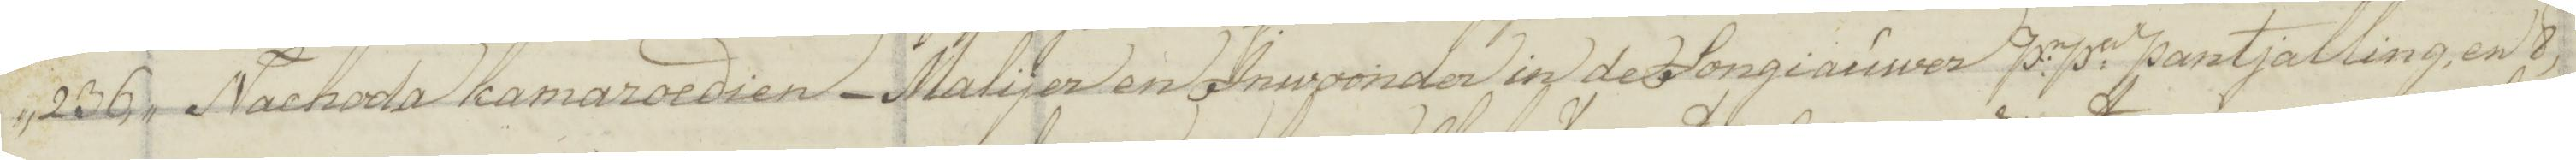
„ 236 „ Nachoda kamaroedien - Malijer en Inwoonder in de Songiauwer p:r p:w pantjalling, en 8„
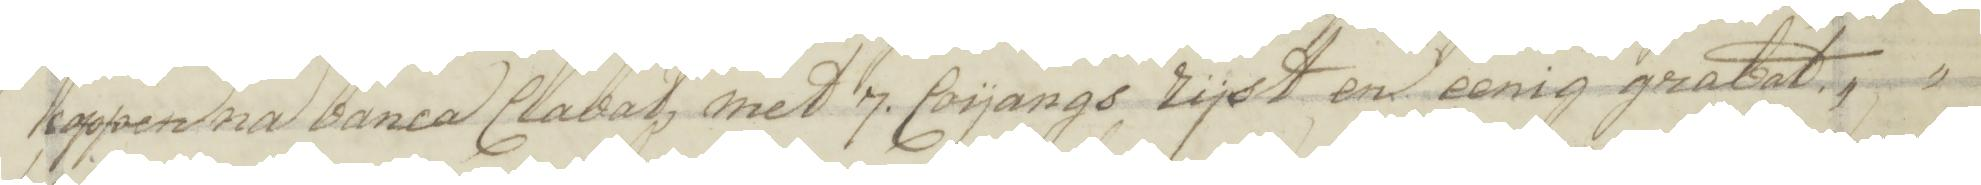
koppen na banca Clabat, met 7. Coijangs rijst en eenig grabat„ „
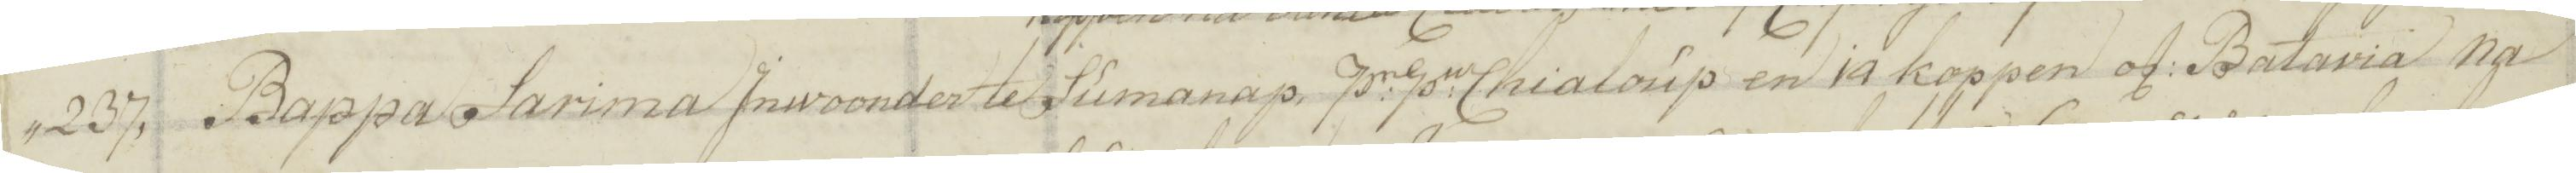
„ 237 Bappa Sarima Jnwoonder te Sumanap, p:r p:w Chialoup en 14 koppen over Batavia na
